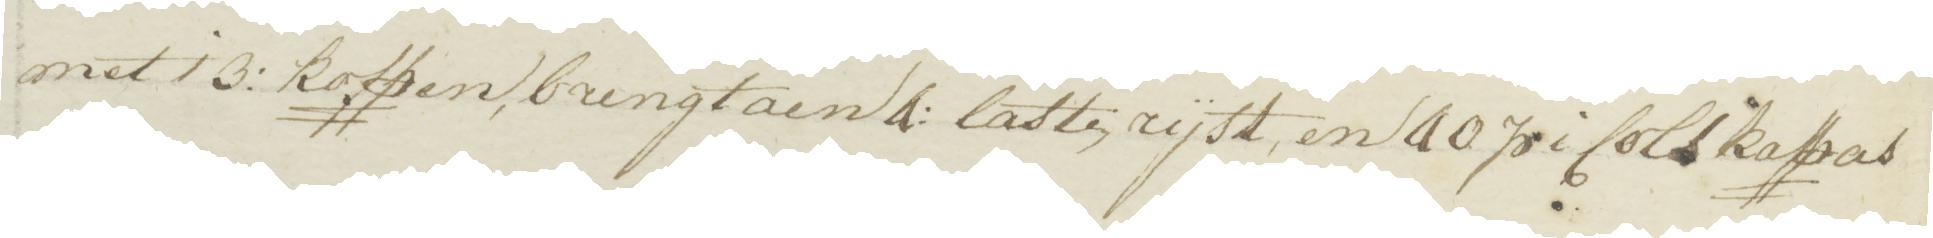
met 13: koppen, brengt aen 4: lasten rijst, en 40 picols kappas
